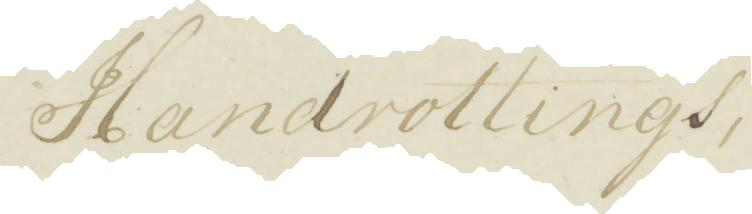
Handrottings,
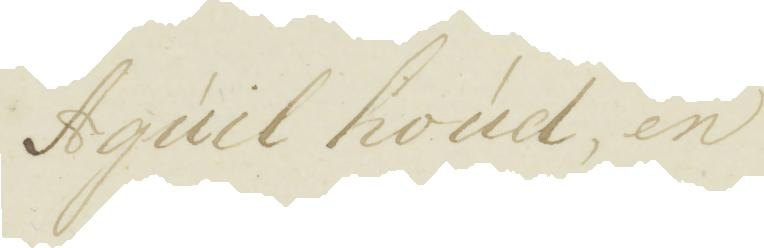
Aquil houd, en
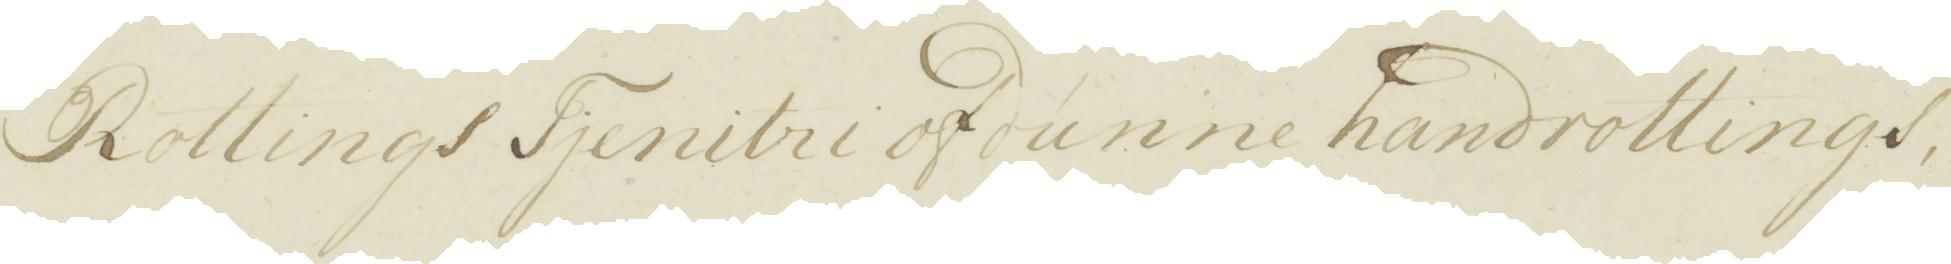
Rottings Tjenitri of dunne handrottings,
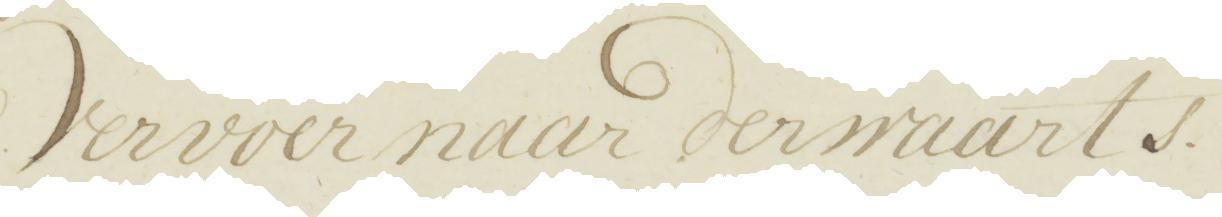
Vervoer naar derwaarts.
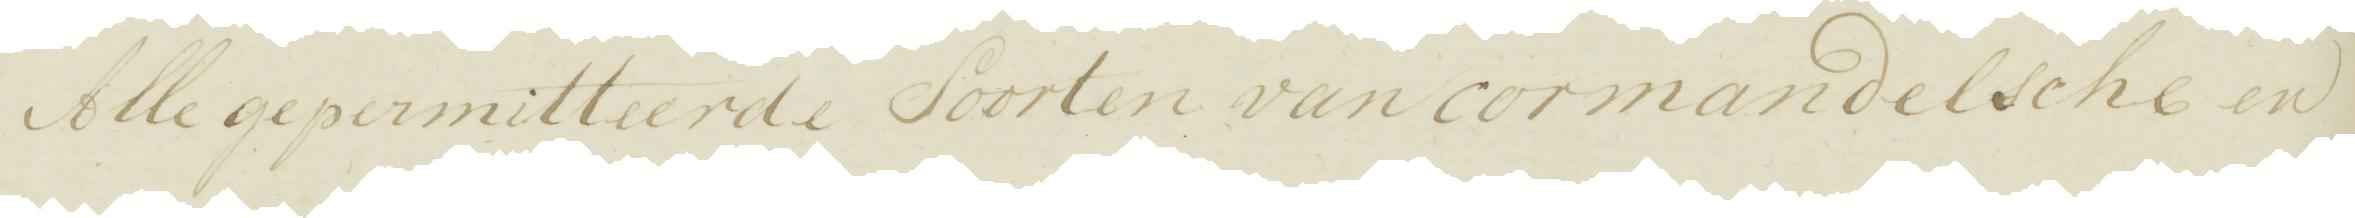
Alle gepermitteerde soorten van cormandelsche en
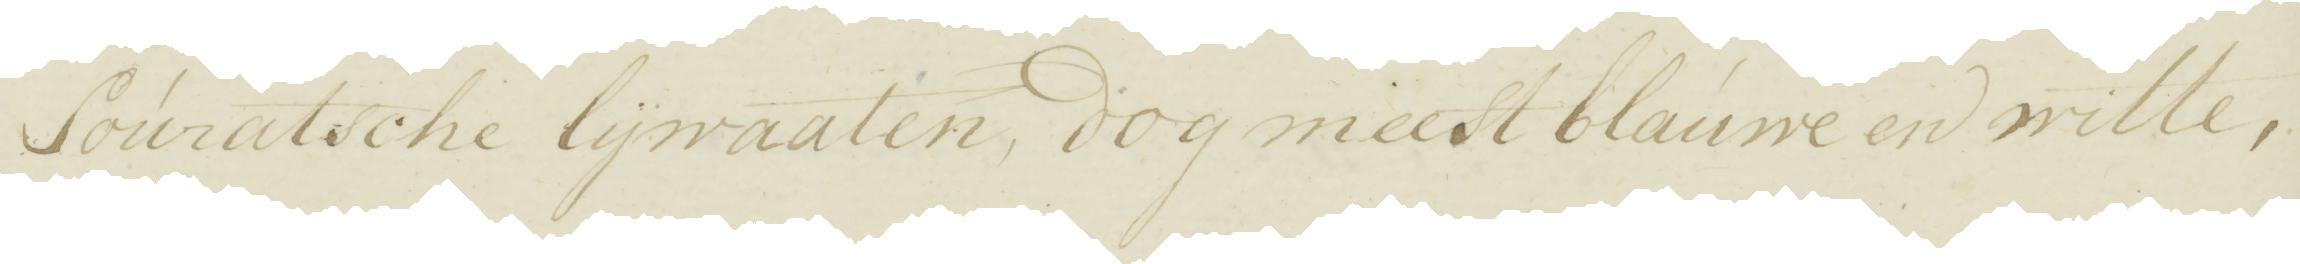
Souratsche lijwaaten, dog meest blauwe en witte,
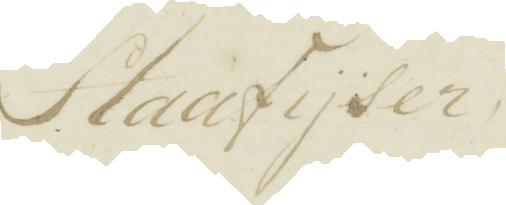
Staafijser
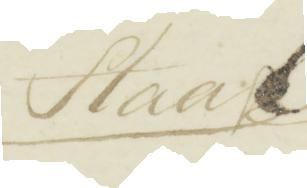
Staal
